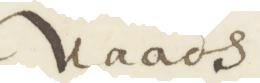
Raads
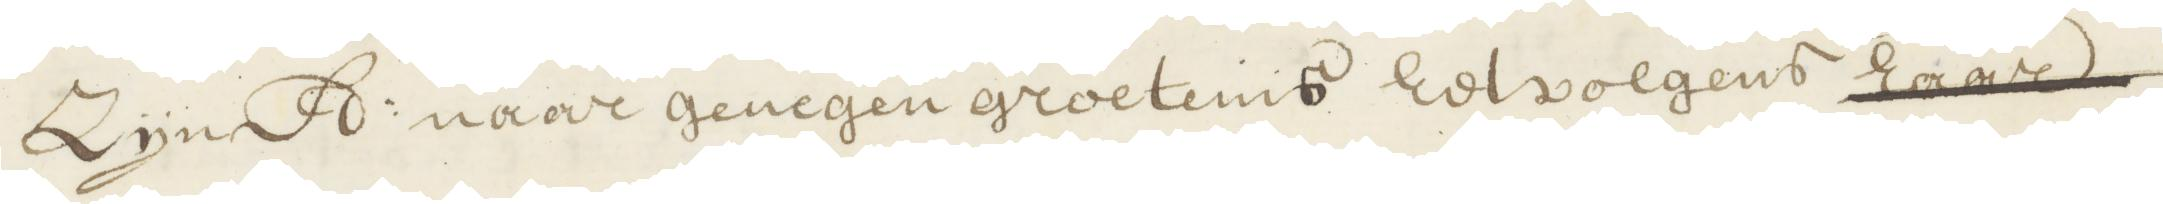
Zijn Ed: naar genegen groetenis het volgens haar
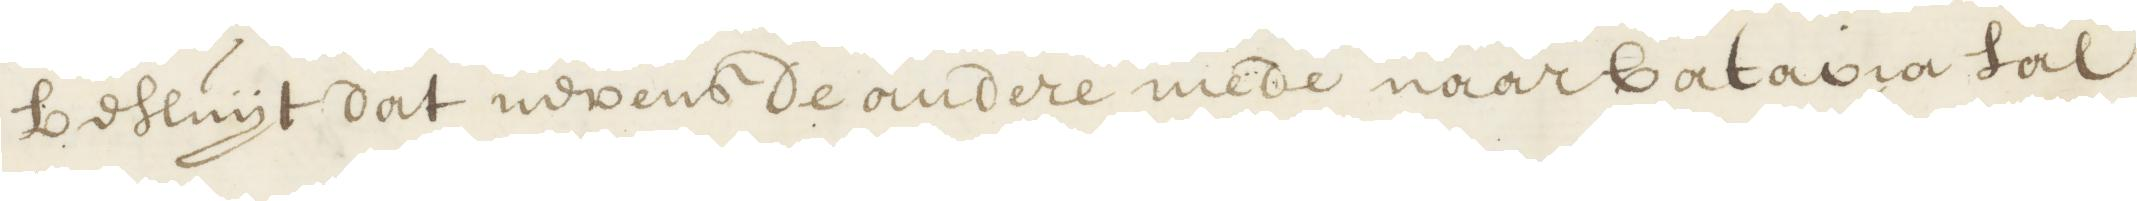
besluijt dat nevens de andere mede naar batavia sal
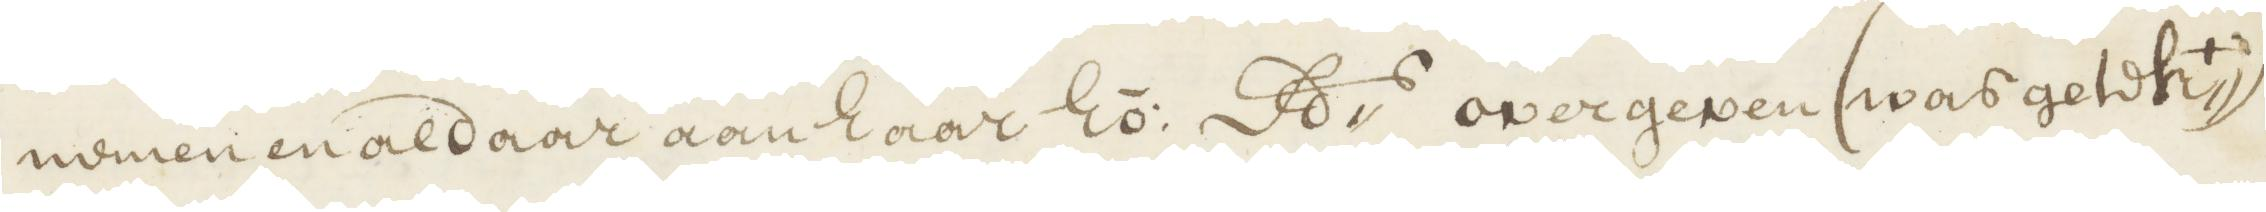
nemen en aldaar aan haar ho: Ed„s overgeven (was getek„t
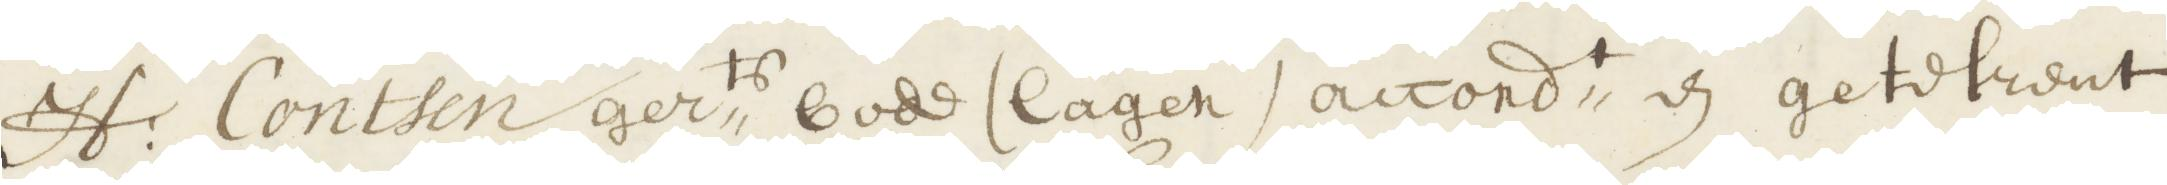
H: Contsen ger„ts bode (lager) accord„t en getekent
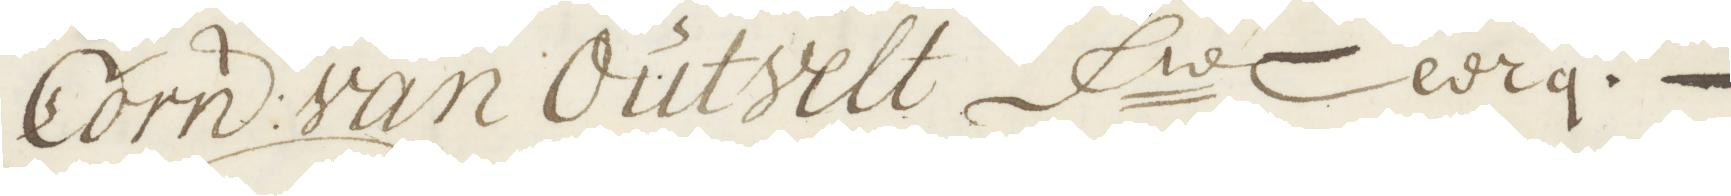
Corn: van Outvelt s=ne Clerq. —
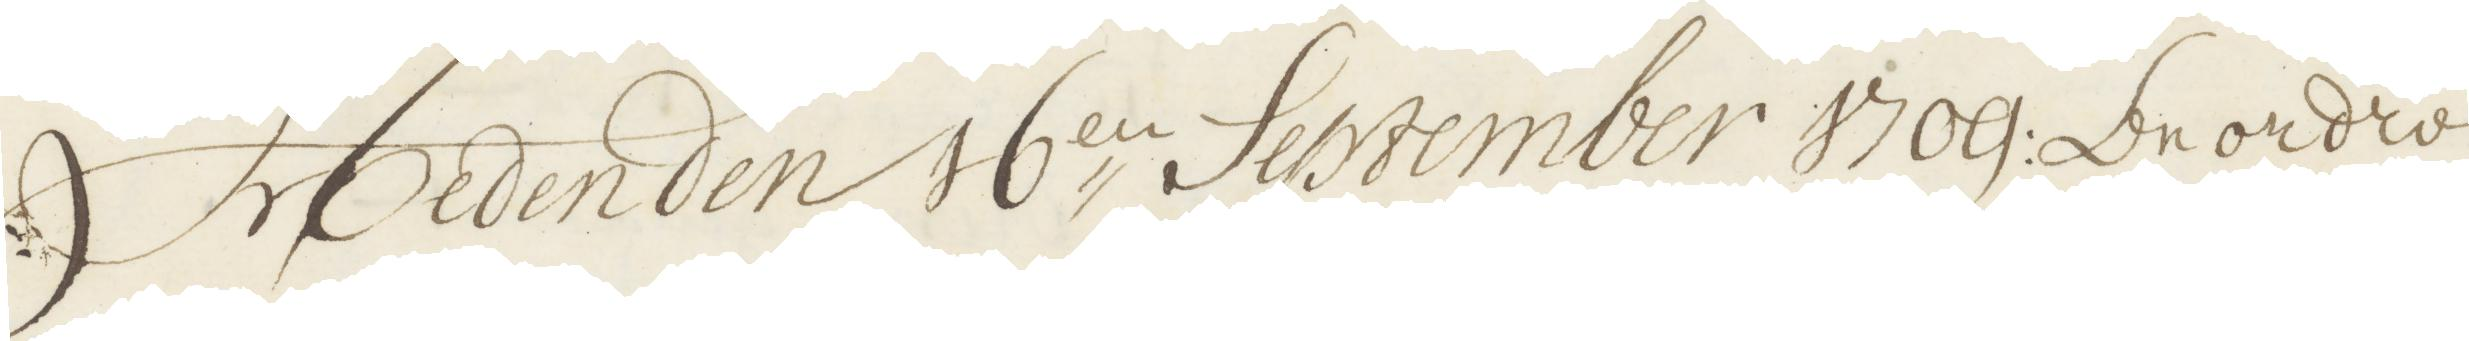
Heden den 16„en September 1709: ter ordre
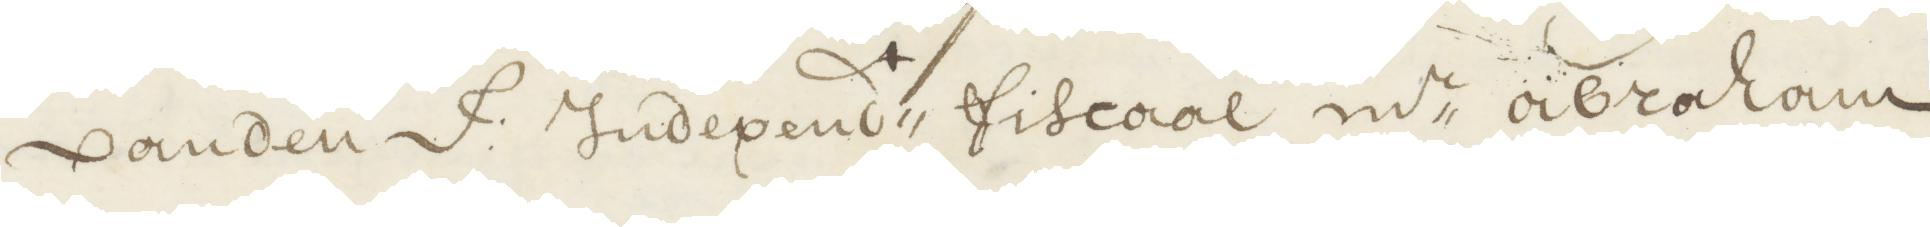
van den E: Jndepend„t fiscaal m„r abraham
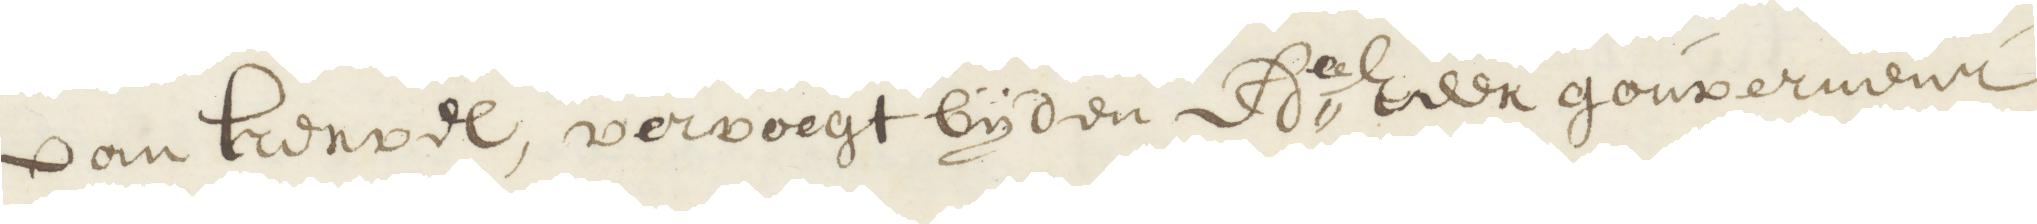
van kervel, vervoegt bij den Ed„le heer gouverneur
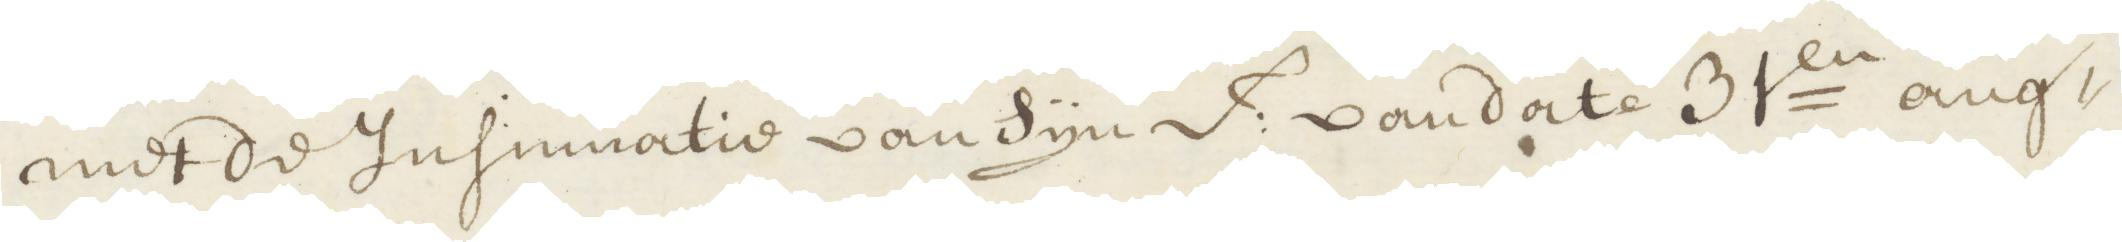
met de Jnsinuatie van sijn E: van dato 31=en aug„o
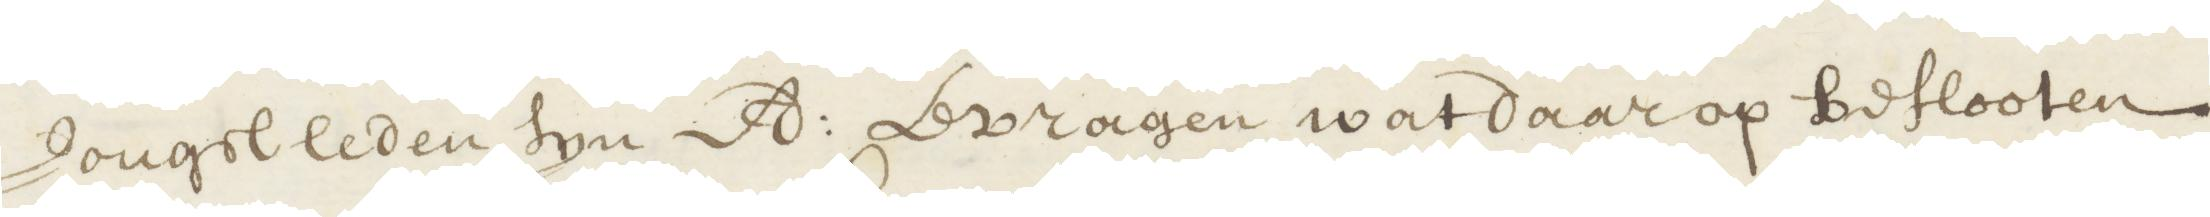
Jongstleden, syn Ed: te vragen wat daar op beslooten
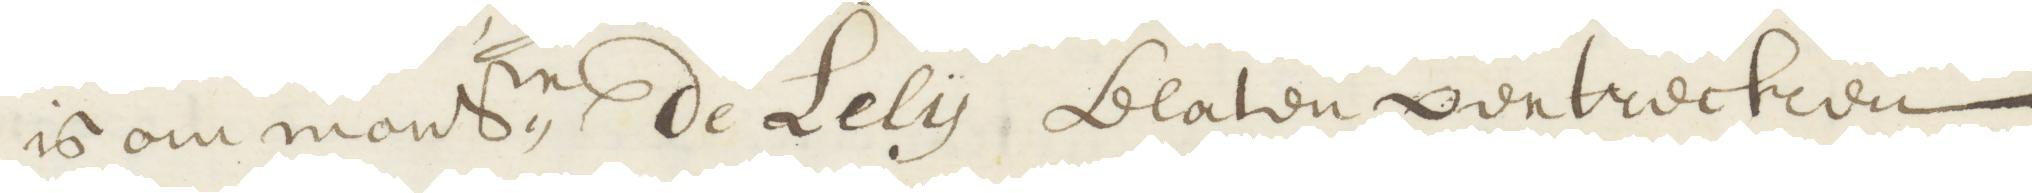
is om mons„r De Lelij te laten vertrecken
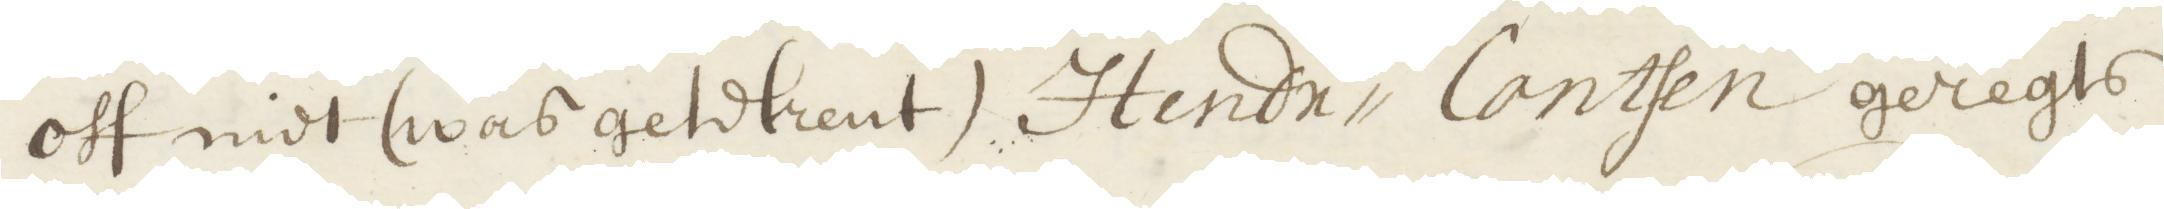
off niet (was getekent) Hendr„k Contsen geregts
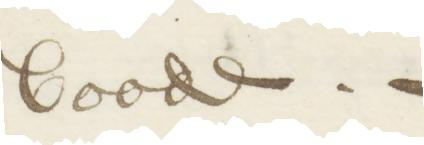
boode. —
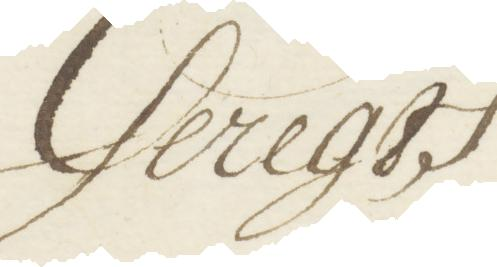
Geregts
